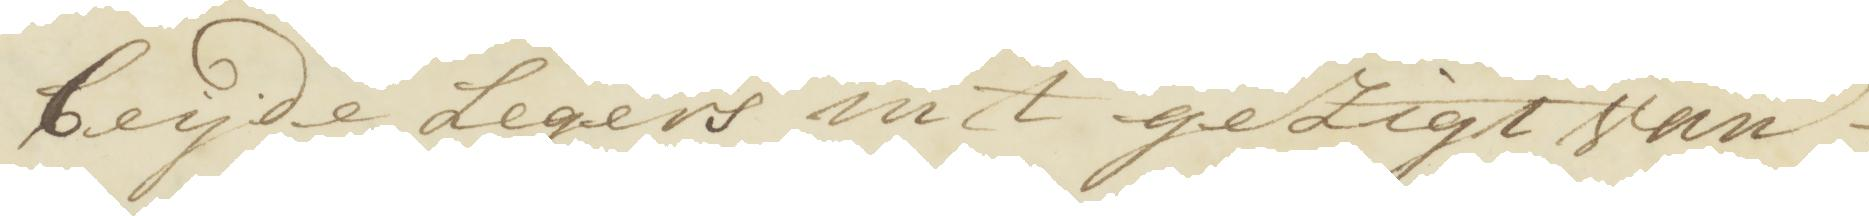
beijde legers in t gezigt van-
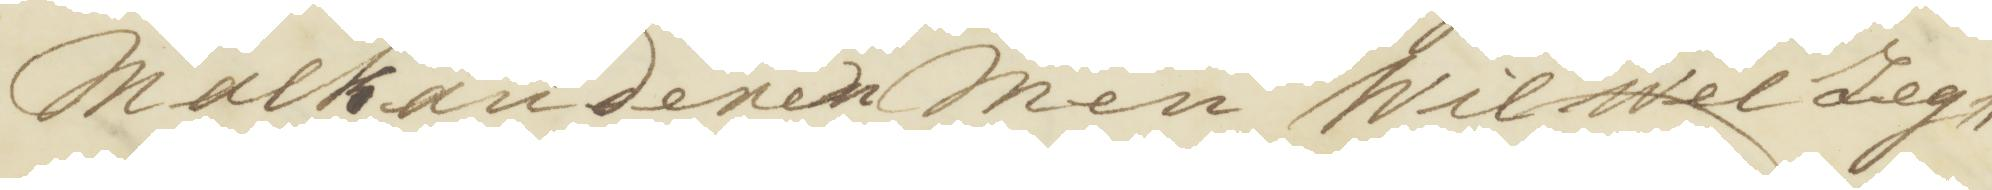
malkanderen men wil wel zeg
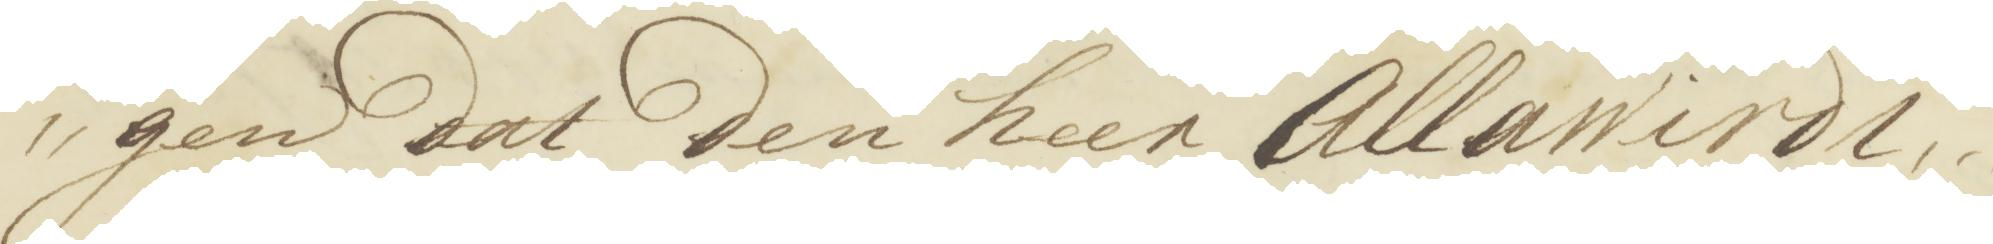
„gen dat den heer Allawirdi,,
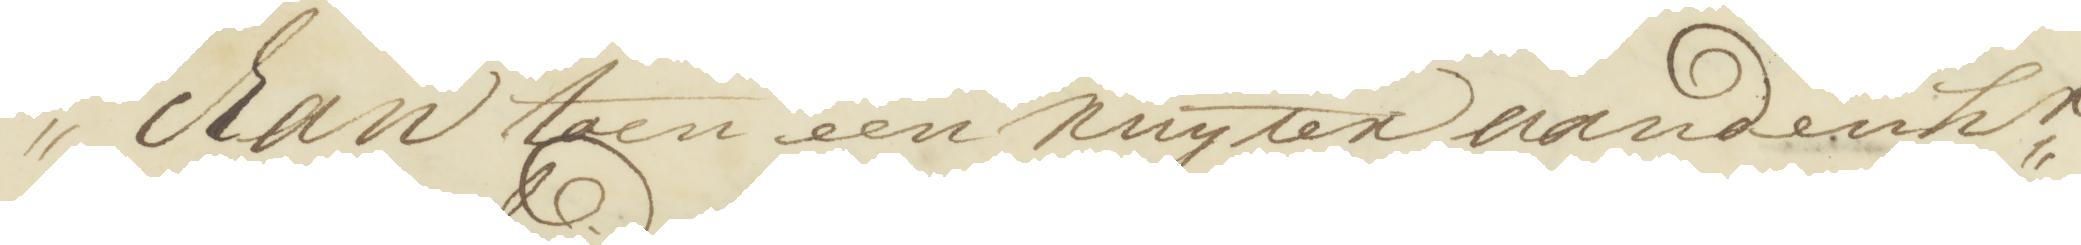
„chan toen een ruijter aandenh„r
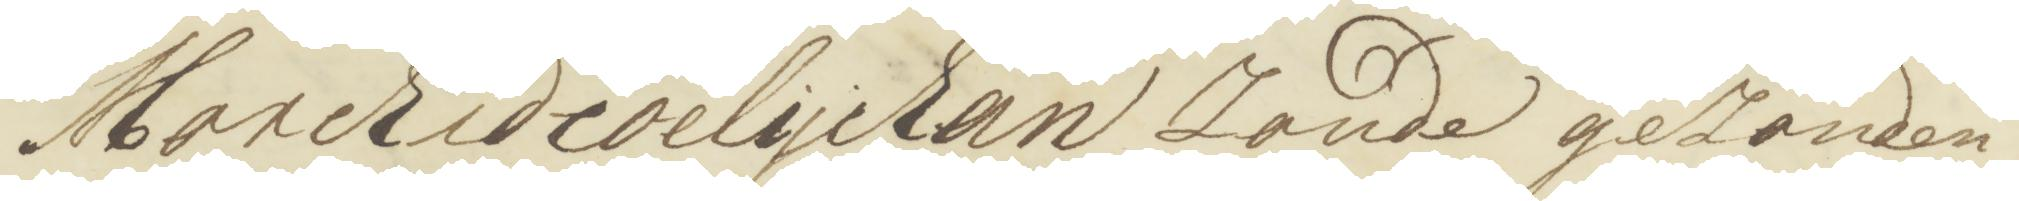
Morchidcoelijchan zoude gezonden
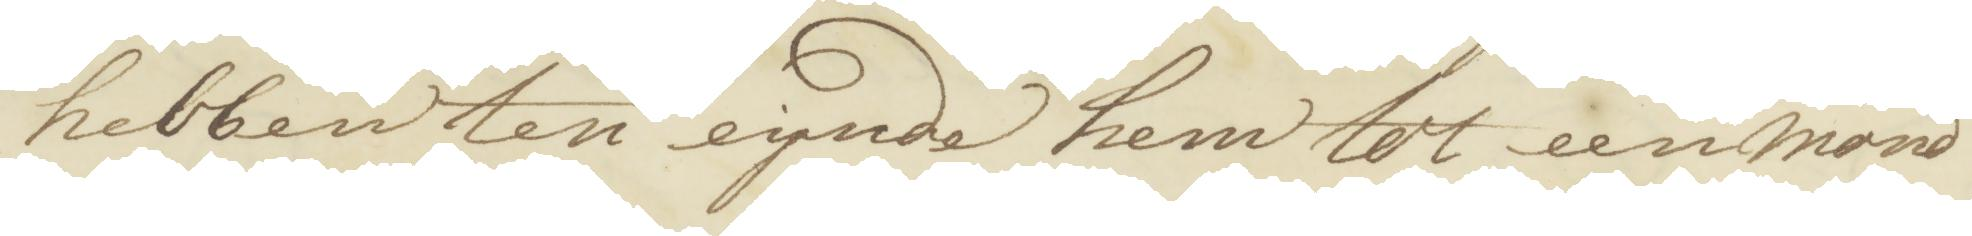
hebben ten eijnde hem tot een mond
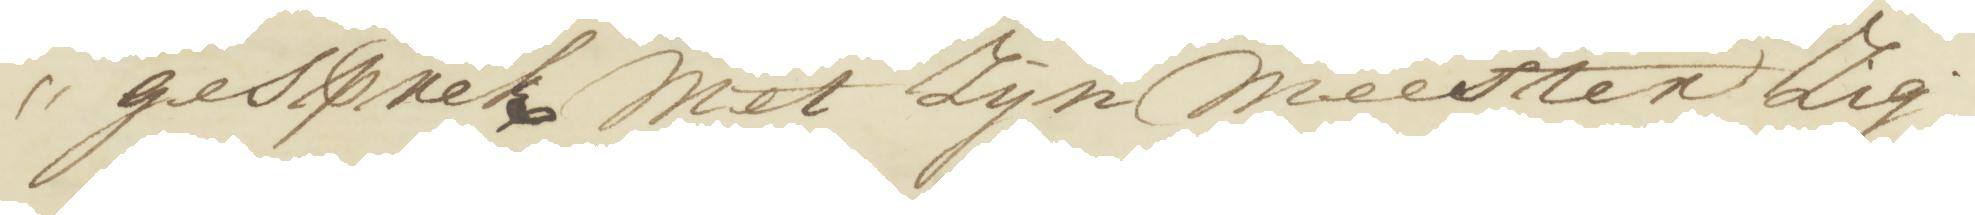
„gesprek met zijn meester zig
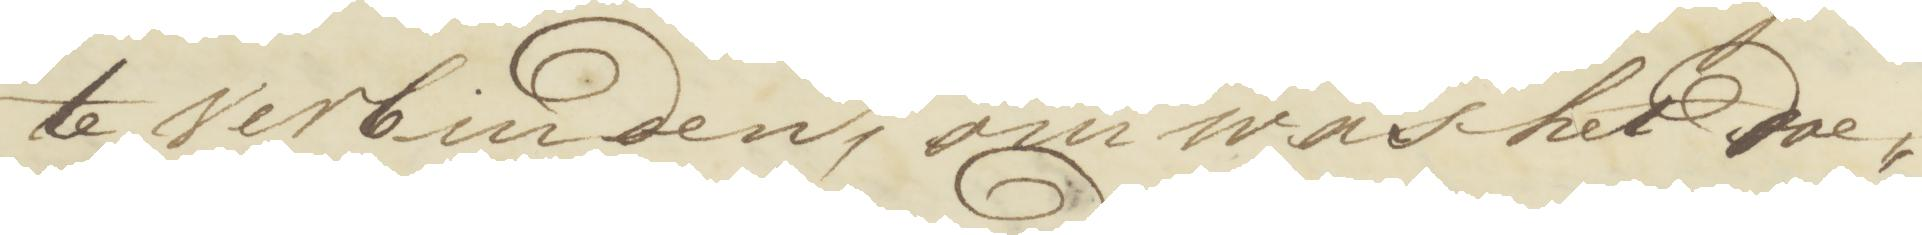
te verbinden, om was het doe„
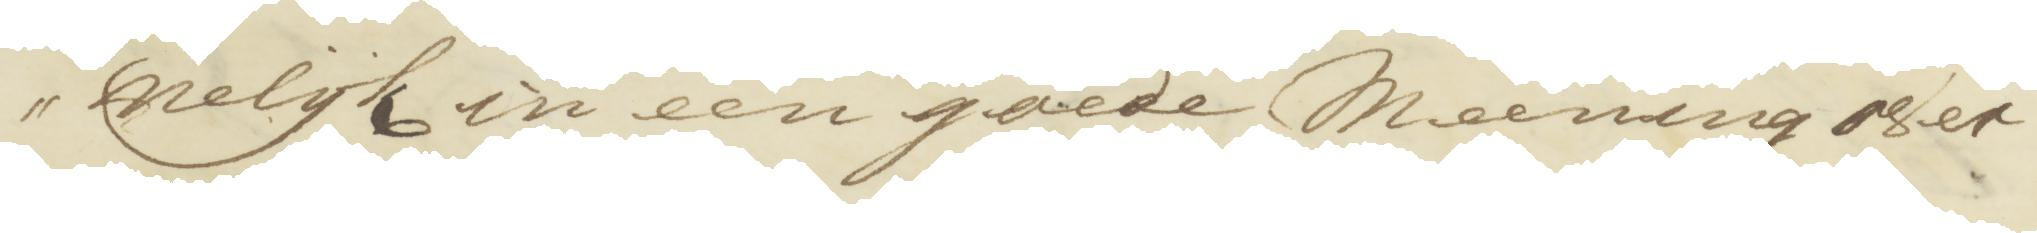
„nelijk in een goede meening over
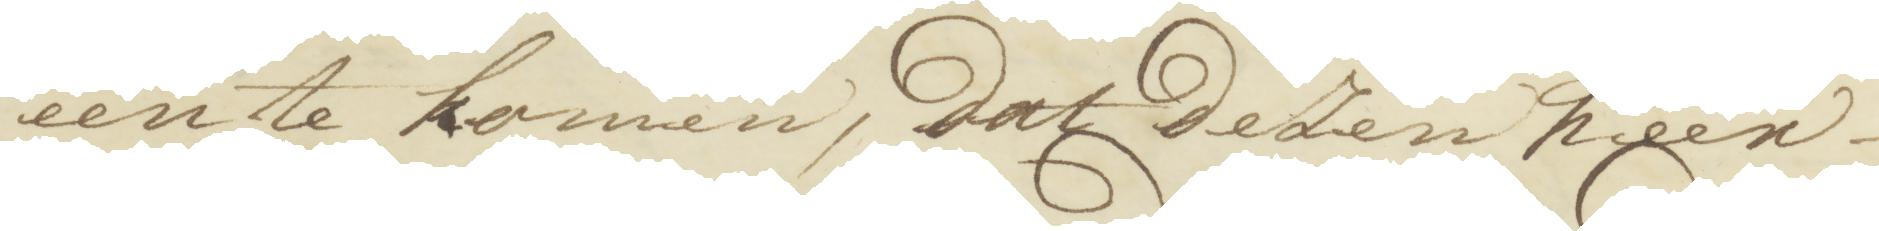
een te komen, dat dezen heer
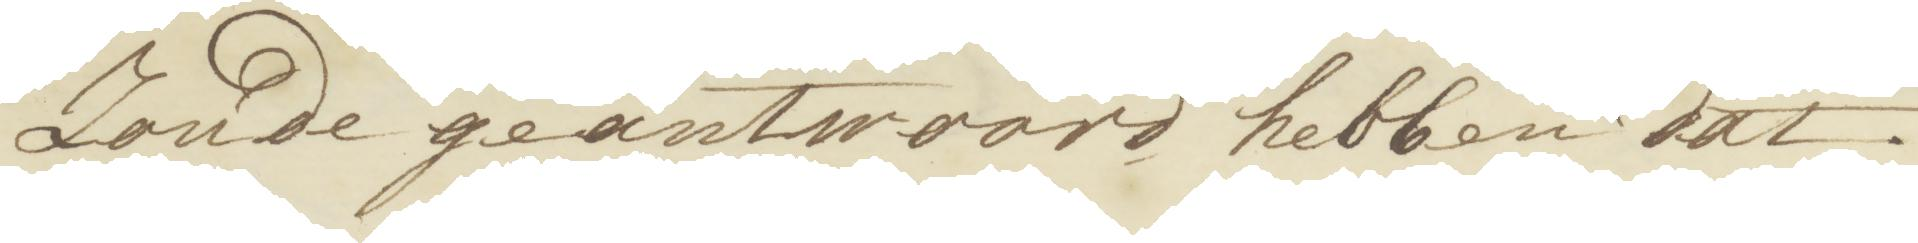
zoude geantwoord hebben dat
